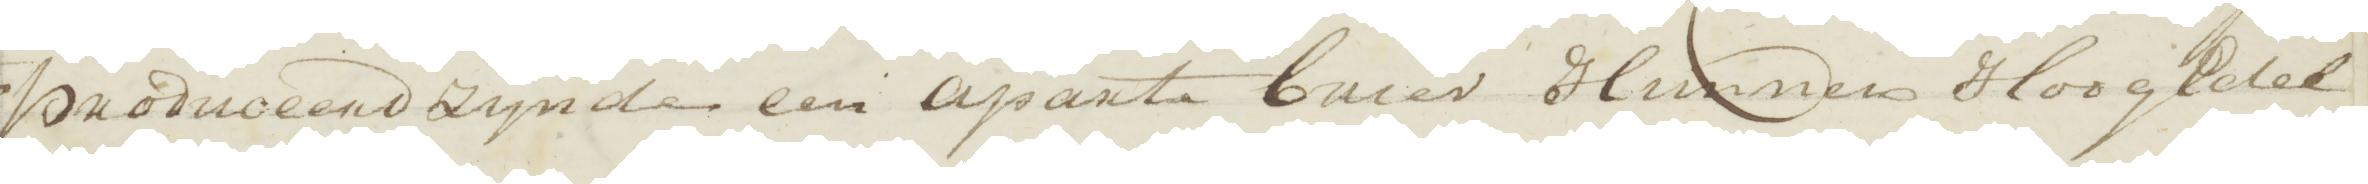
produceerd zijnde een aparte briev Hunnen Hoog Edel
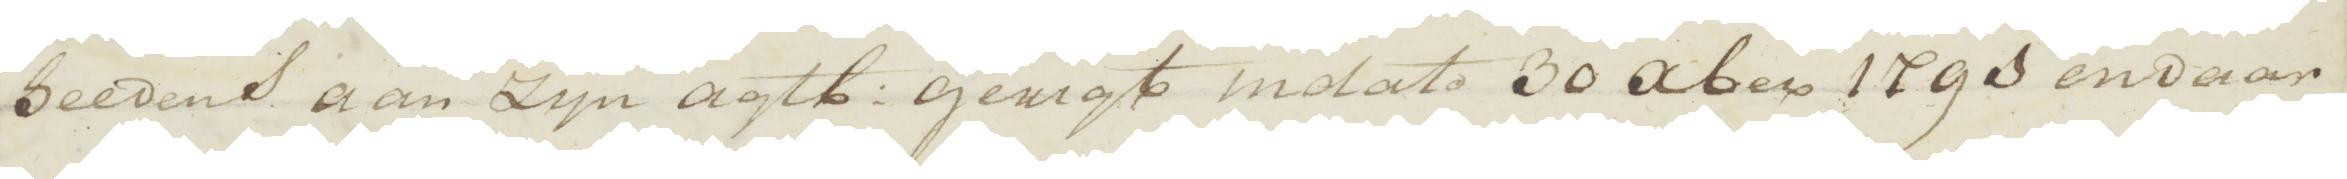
heedens aan zyn agtb: gerigt in dato 30 xber 1791 en daar
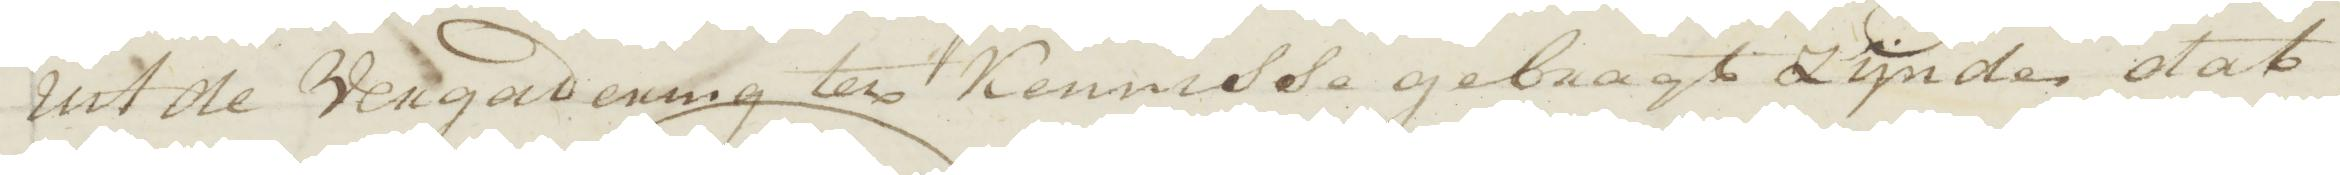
uit de vergadering ter kennisse gebragt zijnde dat
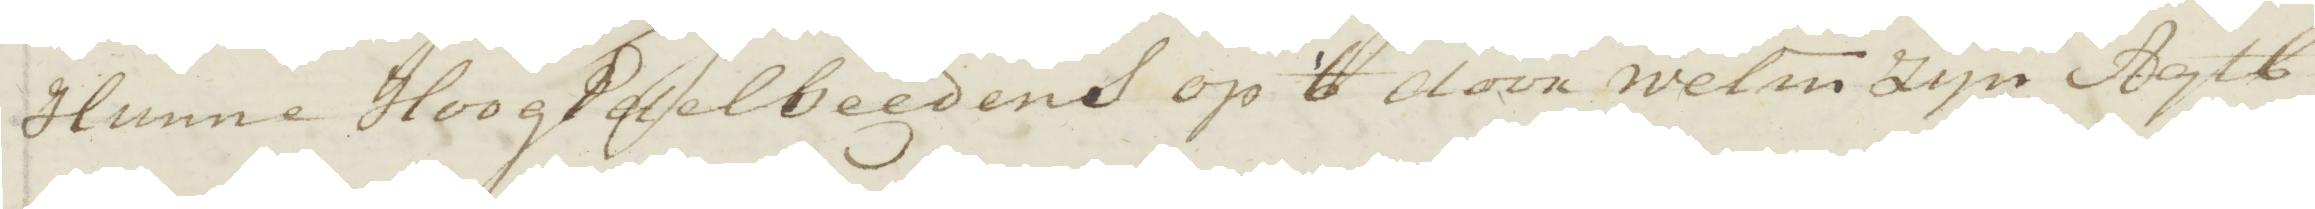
Hunne Hoog Edelheedens op ’t door welm zyn Agtb
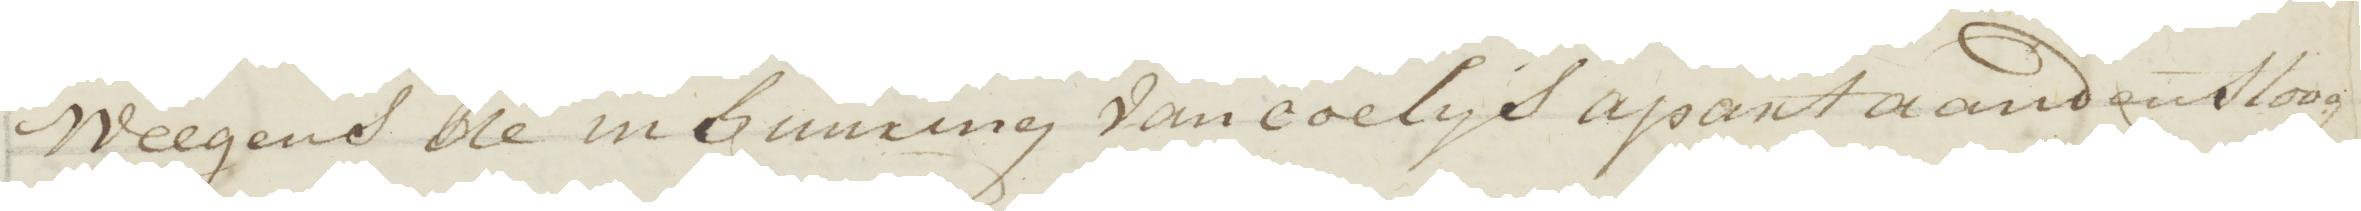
weegens de in huuring van coelys apart aan den Hoog
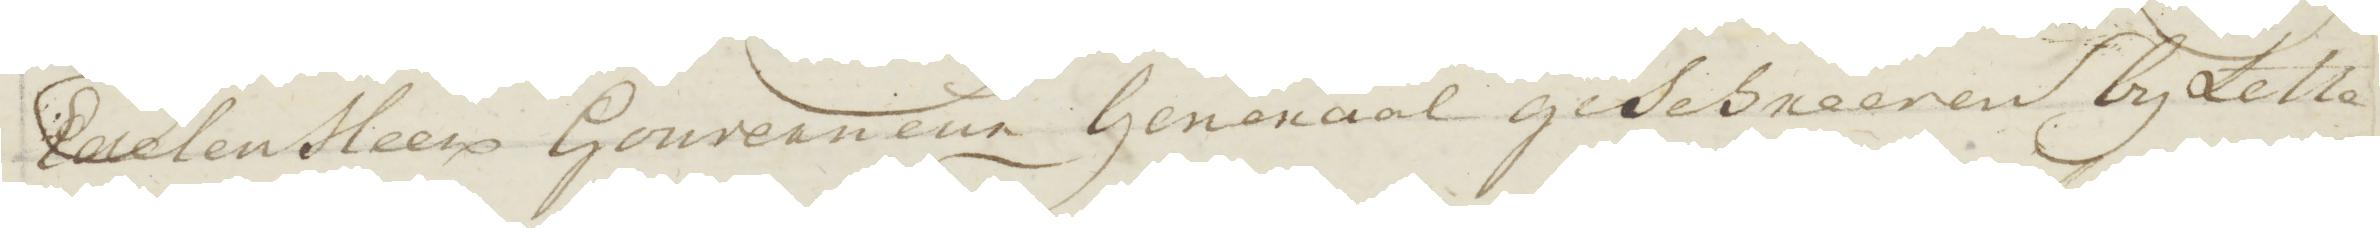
Edelen Heer Gouverneur Generaal geschreeven bij lette
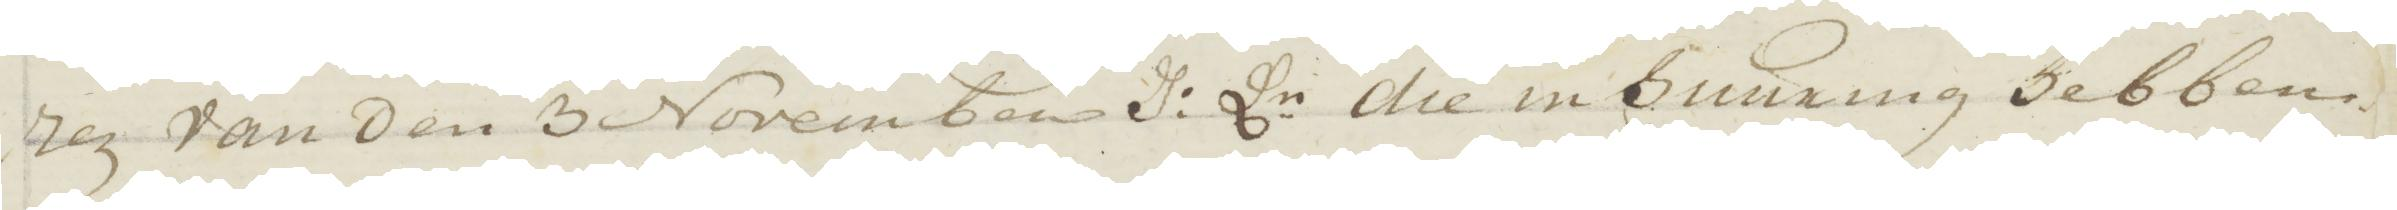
ren van den 3 November J: L„n die in huuring hebben
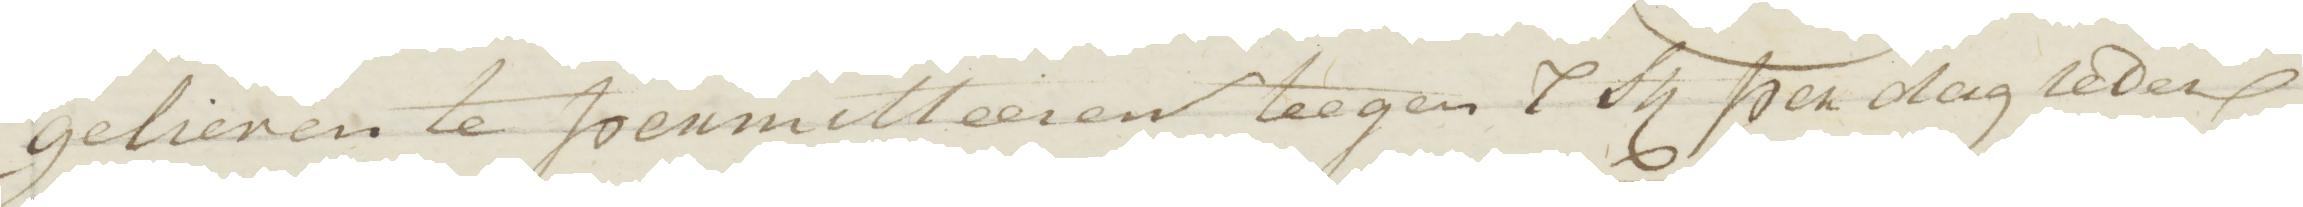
gelieven te permitteeren teegen 7 st/ per dag ieder
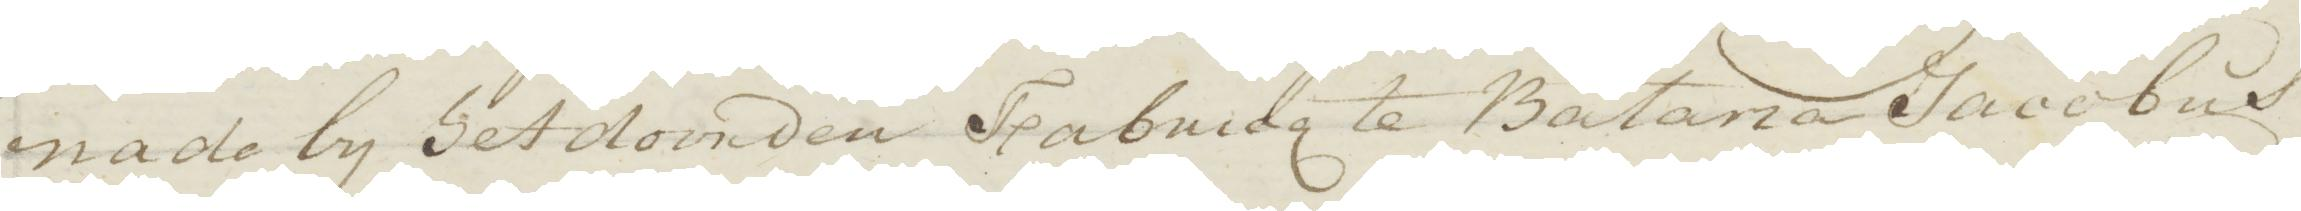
nade by het door den Fabricq te Batavia Jacobus
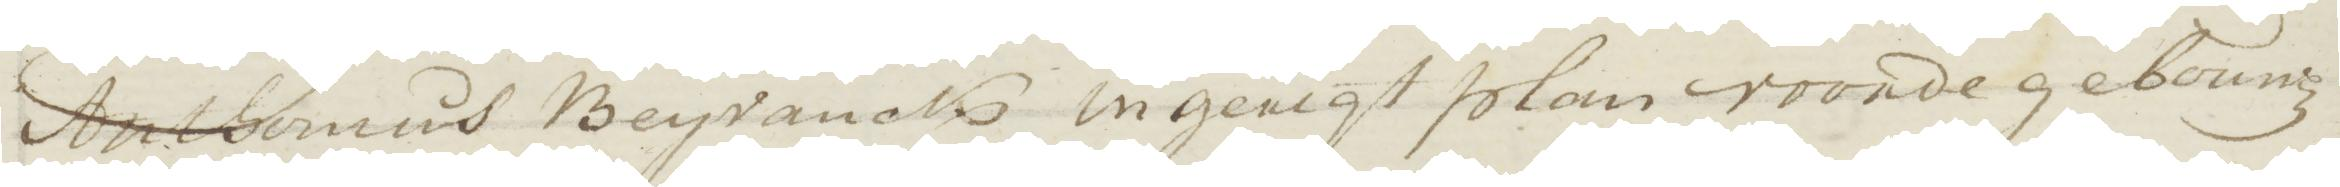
Anthonius Beyvanck ingerigt plan voor de gebouwen
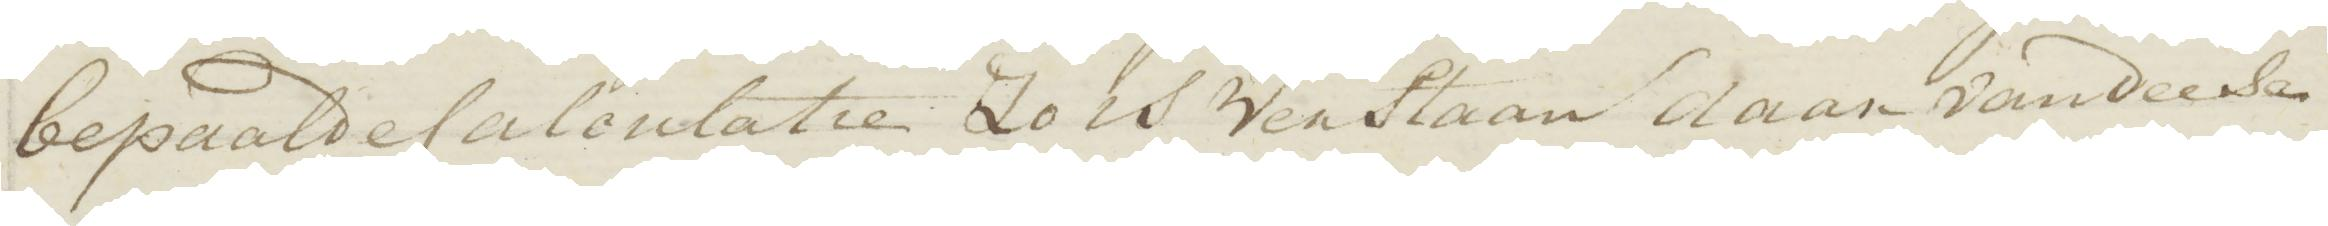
bepaalde Calculatie zo is verstaan daar van deese
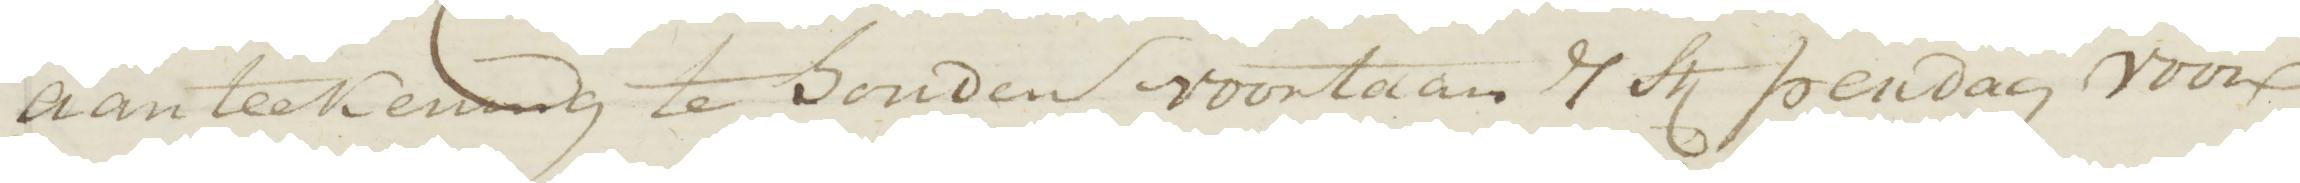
aan teekening te houden voortaan 7 st/ per dag voor
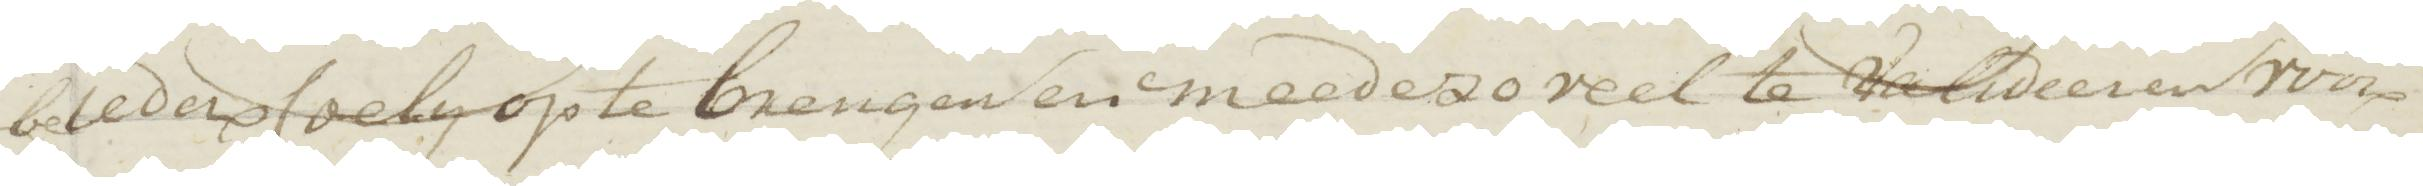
beleden Coely op te brengen en meede zo veel te valideeren voor
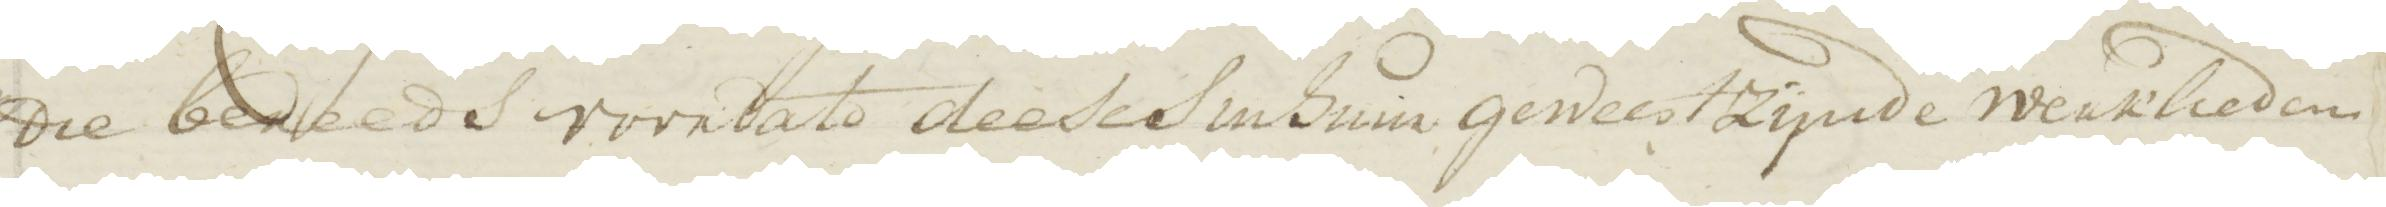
die bereeds voor dato deeses in huur geweest zijnde werklieden
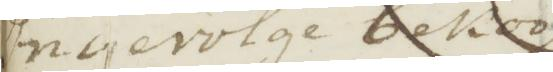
Ingevolge bekoo
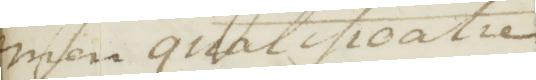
men qualificatie
